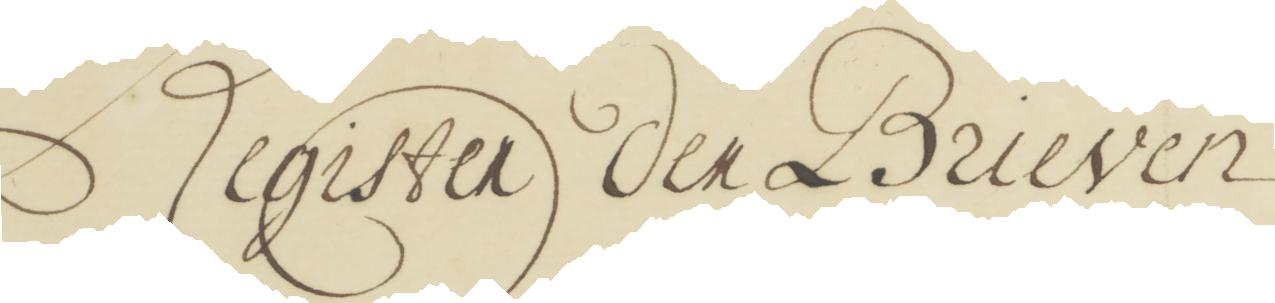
Register der Brieven
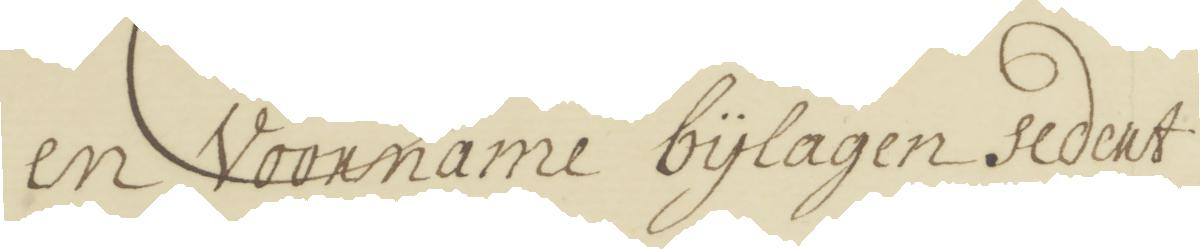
en Voorname bijlagen sedert
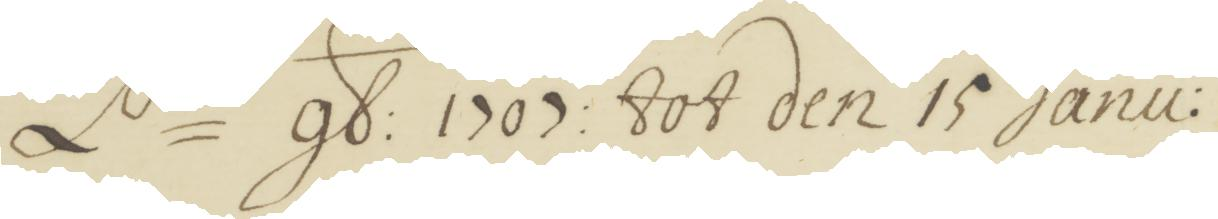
P=mo 9b:re 1707: tot den 15 Janu:
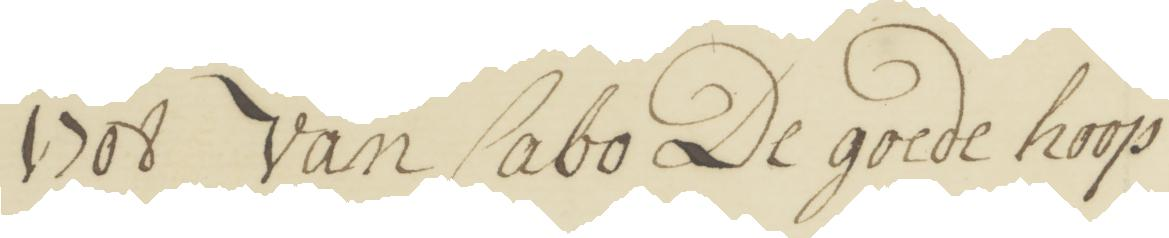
1708 Van Cabo De goede hoop
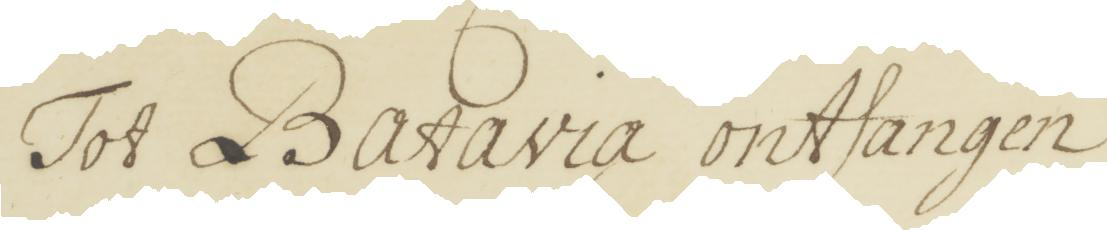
Tot Batavia ontfangen
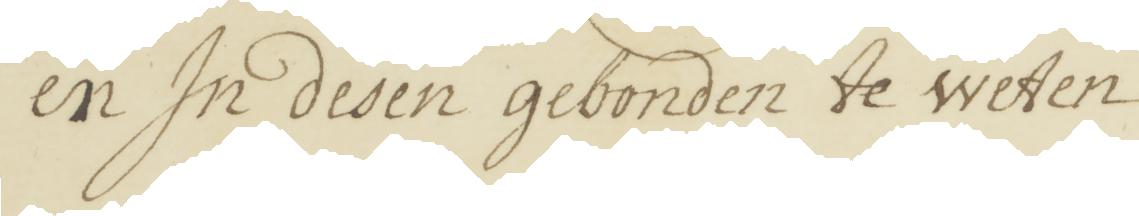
en Jn desen gebonden te weten
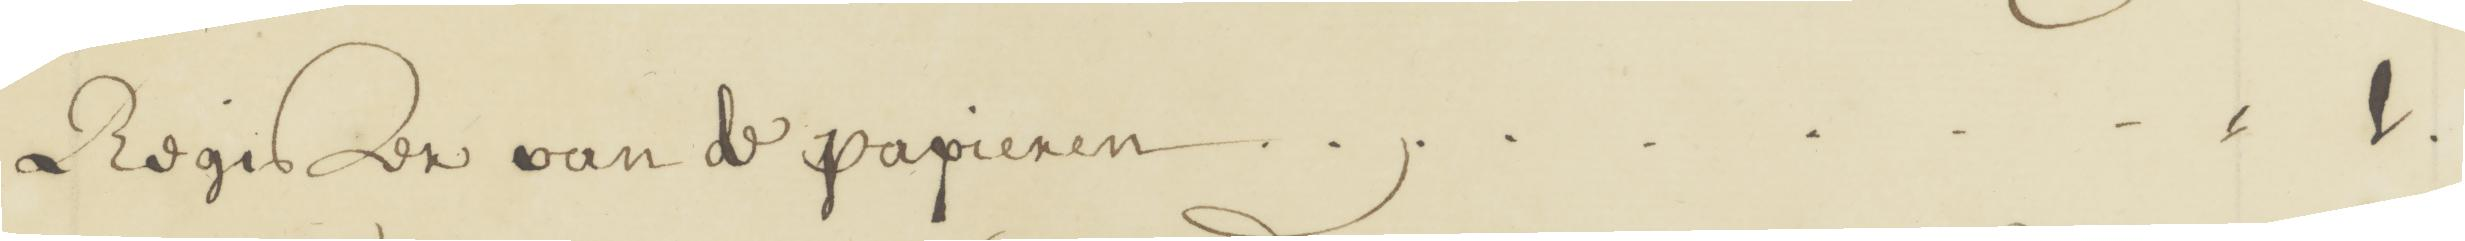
Register van de papieren - - - - - - - - „ 1.
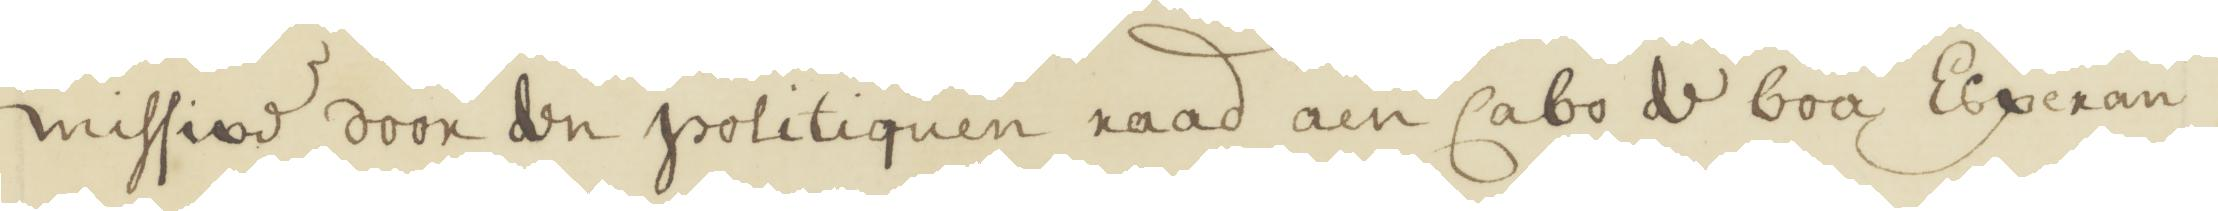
Missive door den politiquen raad aen Cabo de boa Esperan
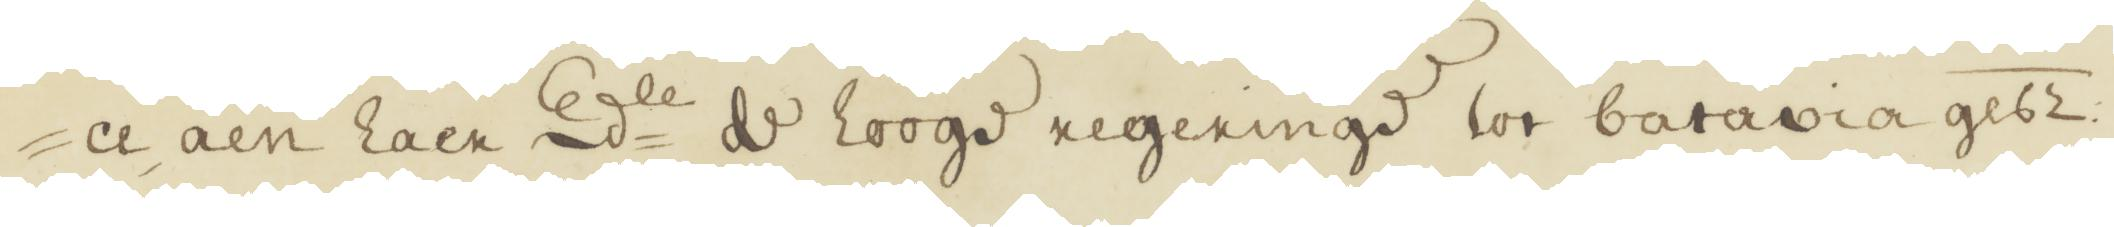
„ce, aen haer Ed=le de hooge regeringe tot batavia gesz:
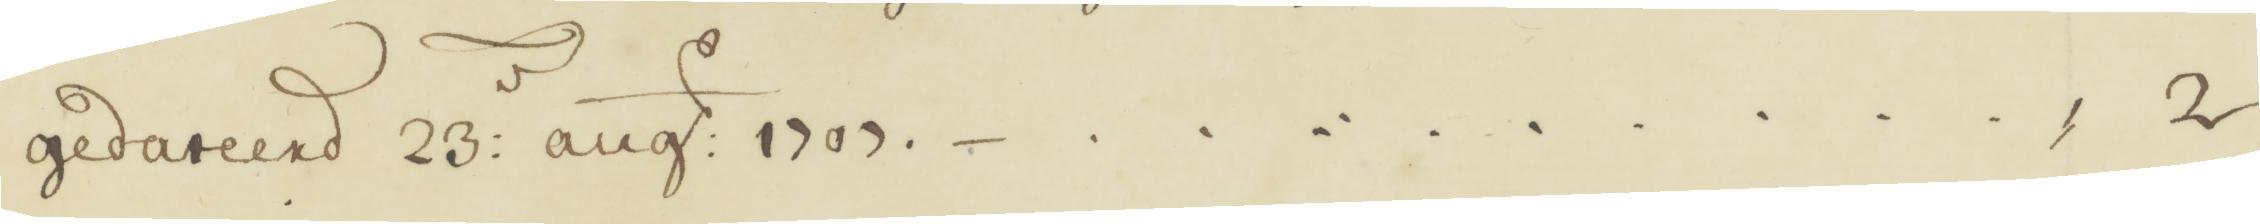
gedateerd 23:e aug:o 1707 - — - - - - - - - - - „ 2
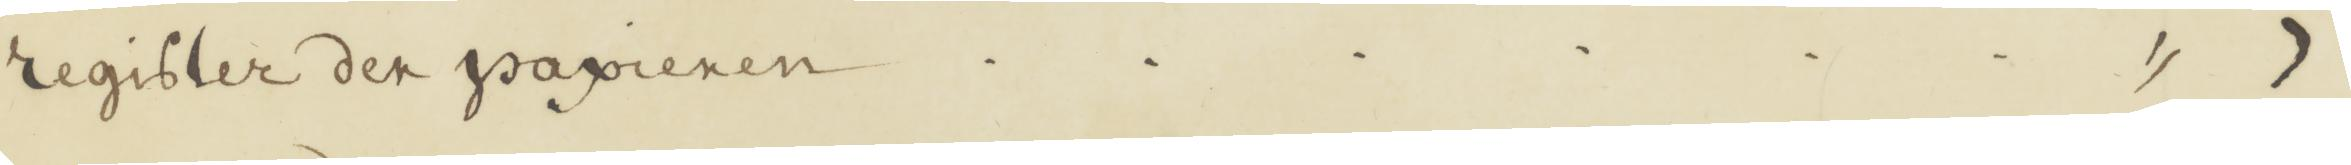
register der papieren - - - - - - „ 7
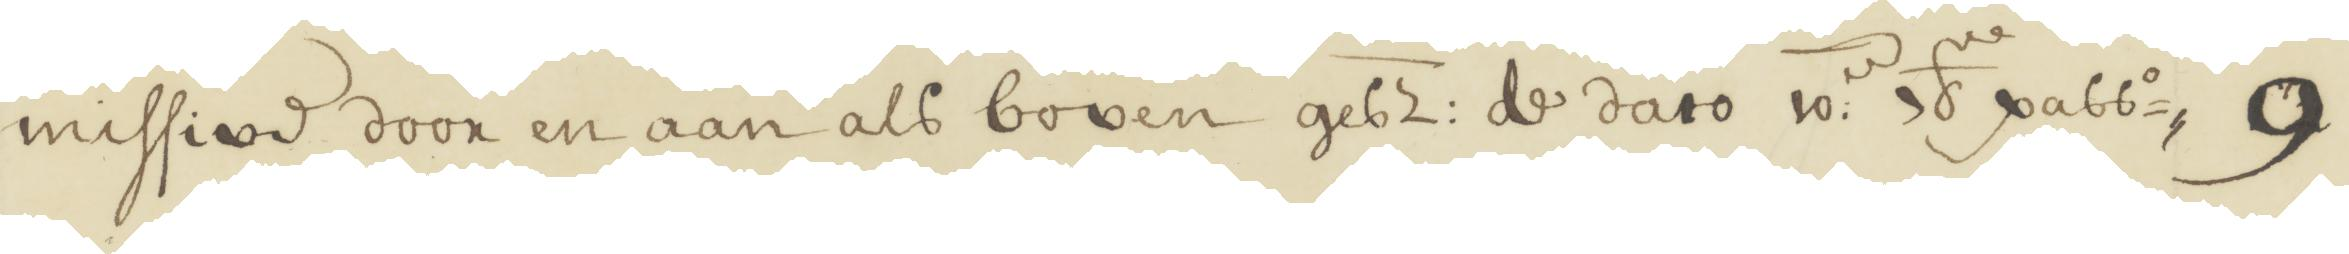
missive door en aan als boven gesz: de dato 10:e 7bre pass=o „ 9
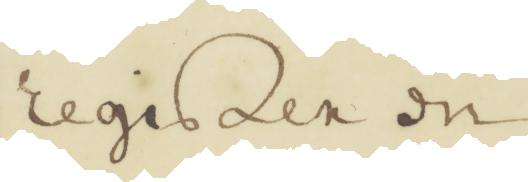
register en
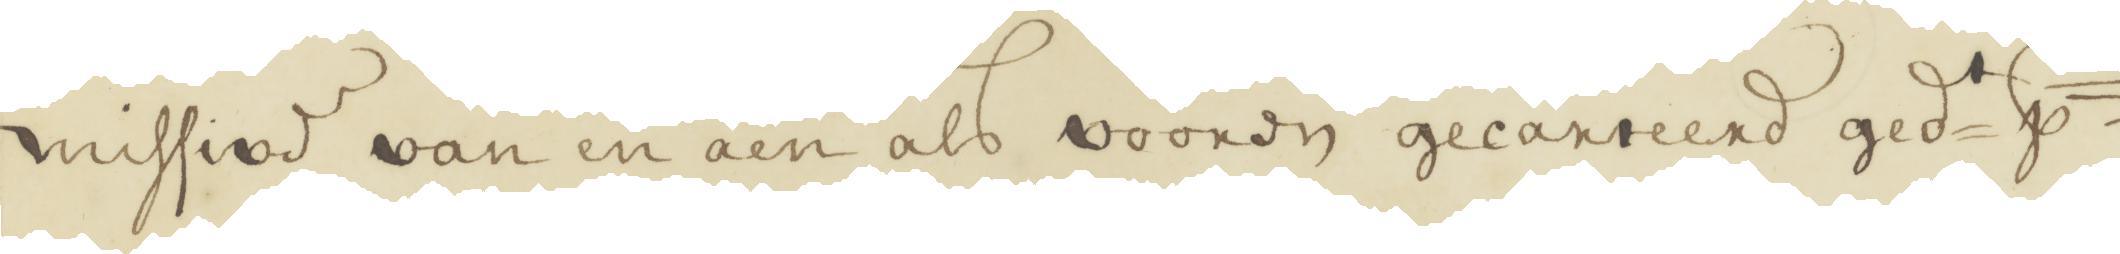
Missive van en aen als vooren gecarteerd ged=t p=mo
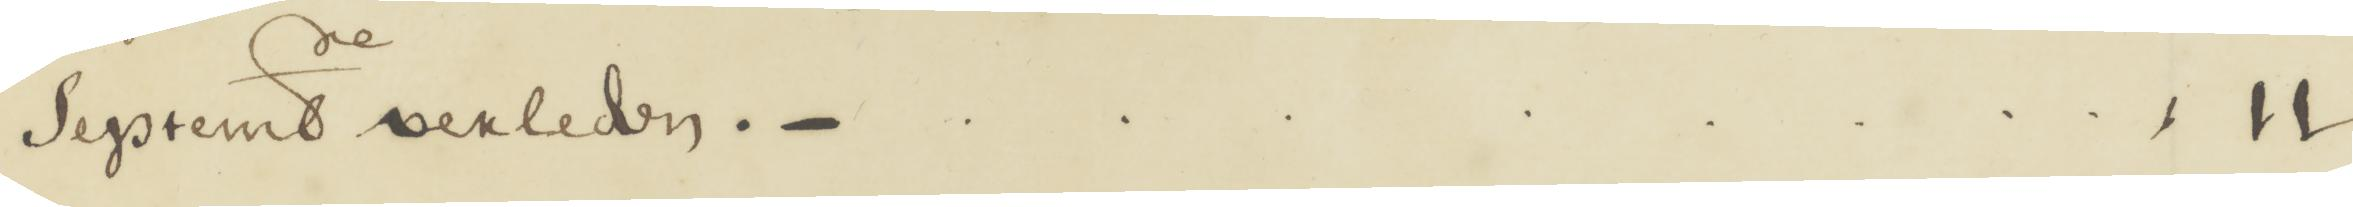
Septembre verleden. — - - - - - - - - „ 11
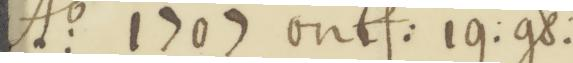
A:o 1707 ontf: 19:e 9b:re
